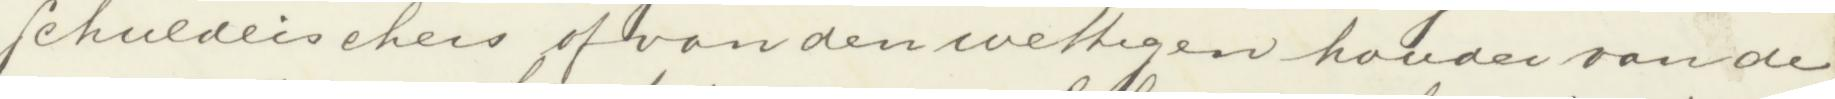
schuldeischers of van den wettigen houder van de
